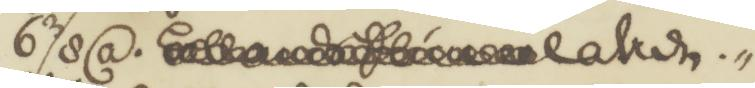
6 3/8 @. hollandsfluweel laken .
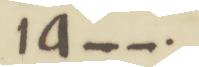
14 – – .
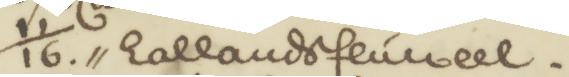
1/16. „ hollandsfluweel
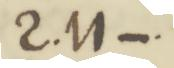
2.11 –
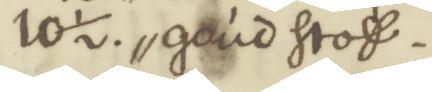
10½. „ goud stof
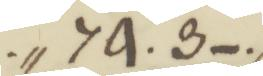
„ 74. . –
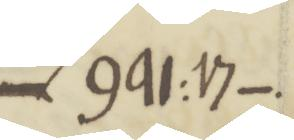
ƒ941:17– .
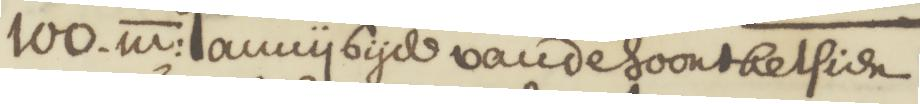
100. m: tannij sijde van de soort ketsier
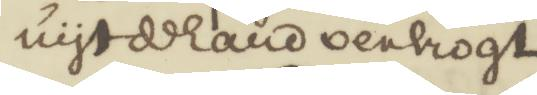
uijt de hand verkogt
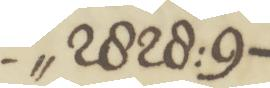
„ 2828:9
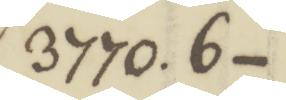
3770.6 –
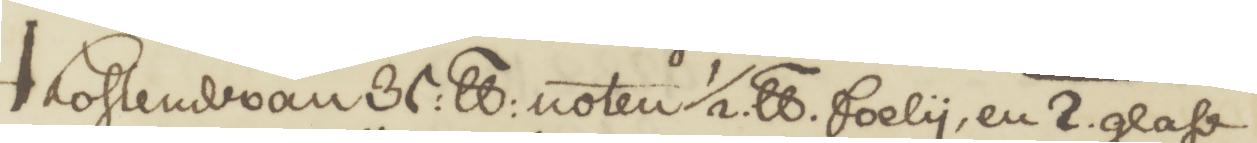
't kostende van 35: lb: noten ½. lb. foelij, en 2. glase
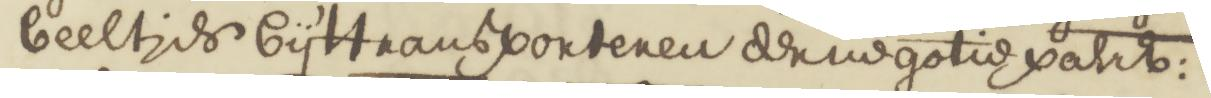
beeltjes bij't transporteren der negotie pakt:
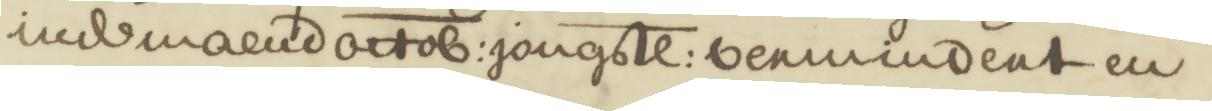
inde maend octob: jongstl: vermindert en
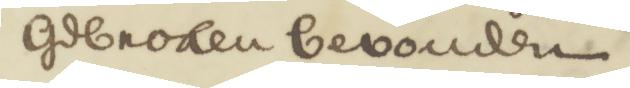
gebroken bevonden
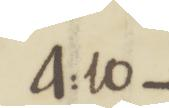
4:10 –
